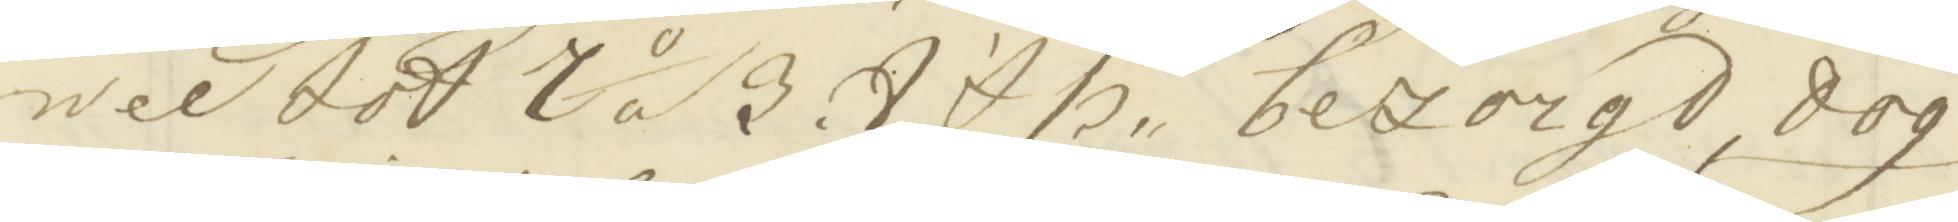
wel tot r:o/a 3.8 't p„s bezorgd, dog
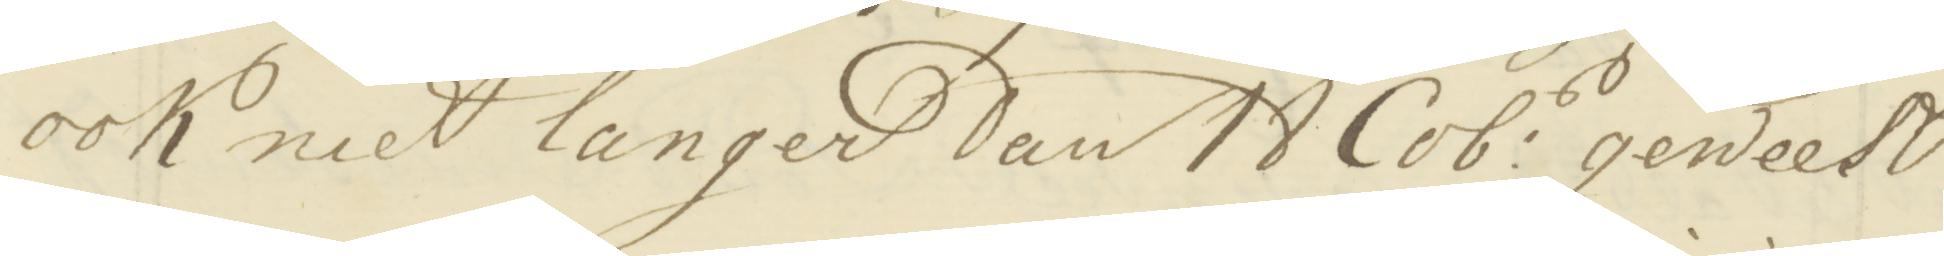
ook niet langer dan 18 Cob:s geweest
